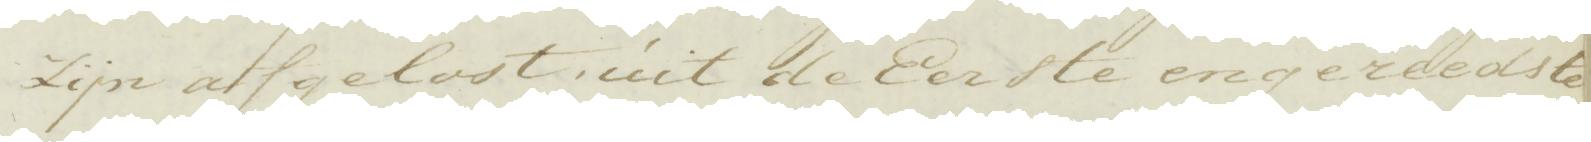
zijn afgelost uit de Eerste en gereedste
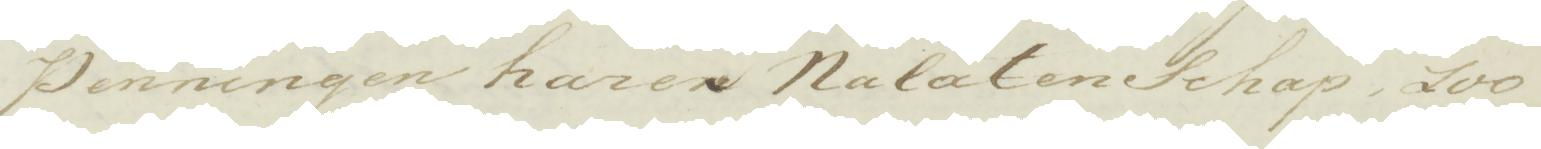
Penningen haren Nalatenschap, zoo
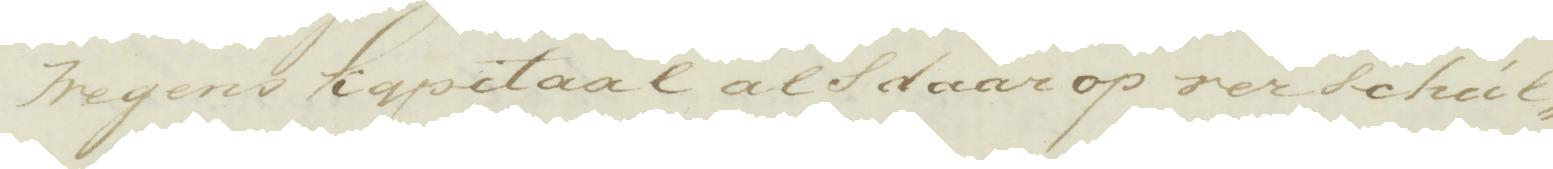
wegens kapitaal als daar op verschul
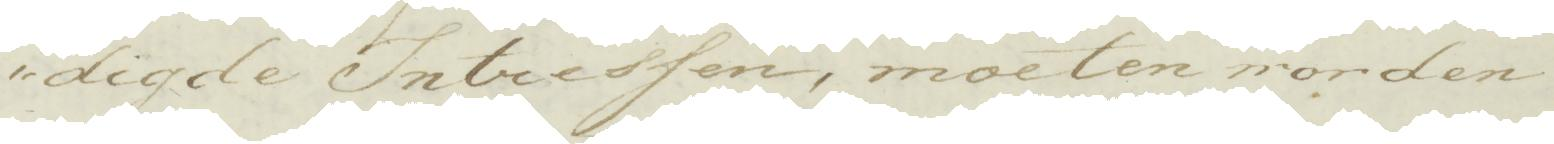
„digde Intressen, moeten worden
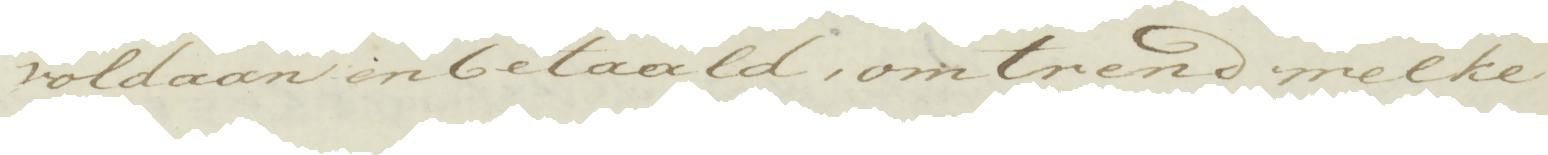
voldaan en betaald, omtrend welke
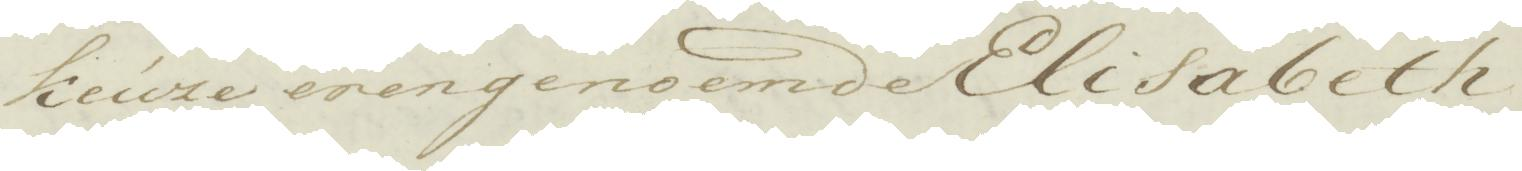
keuze evengenoemde Elisabeth
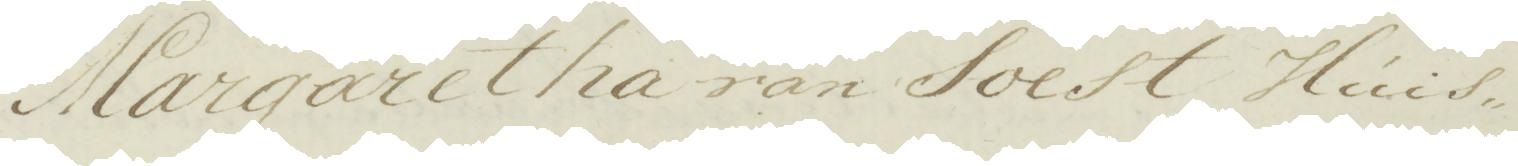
Margaretha van Soest Huis„
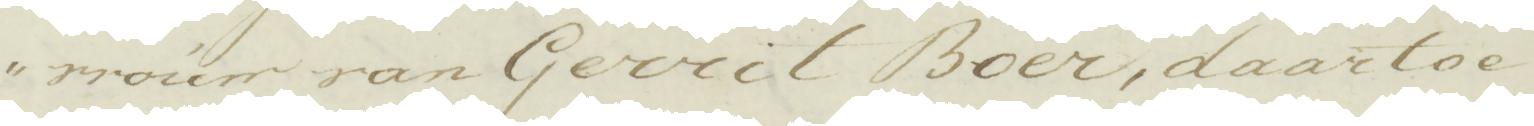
„vrouw van Gerrit Boer, daartoe
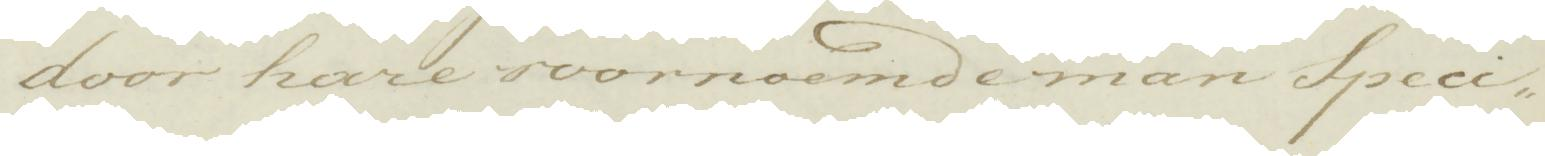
door hare voornoemde man Speci„
